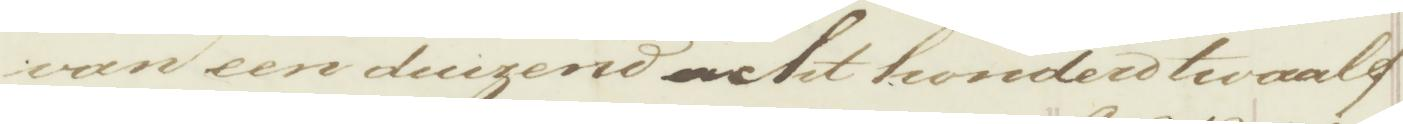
van een duizend acht honderd twaalf
